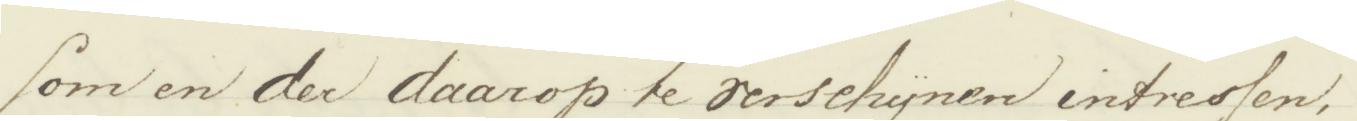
som en der daarop te verschijnen intressen,
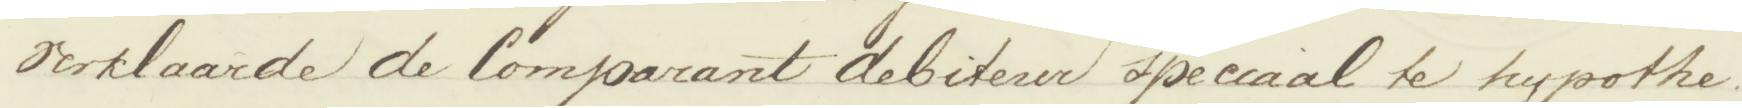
verklaarde de Comparant debiteur speciaal te hypothe
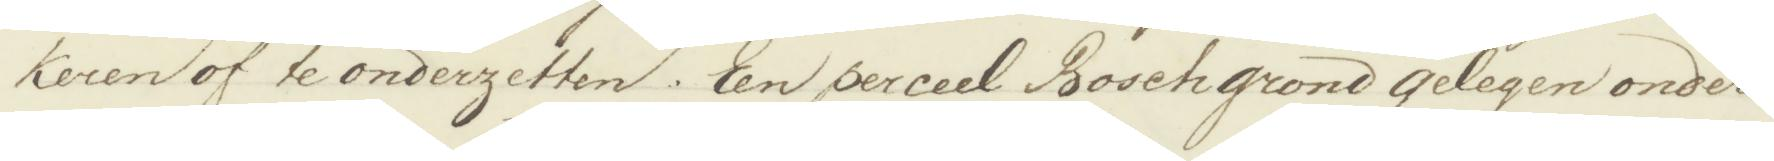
keren of te onderzetten: Een perceel Boschgrond gelegen onder
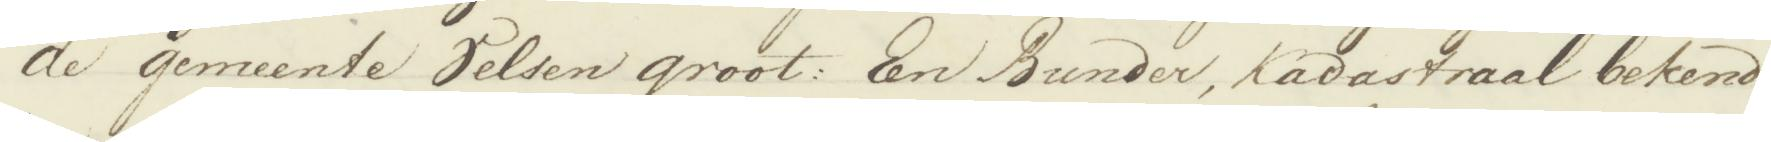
de gemeente Velsen groot: Een Bunder, Kadastraal bekend
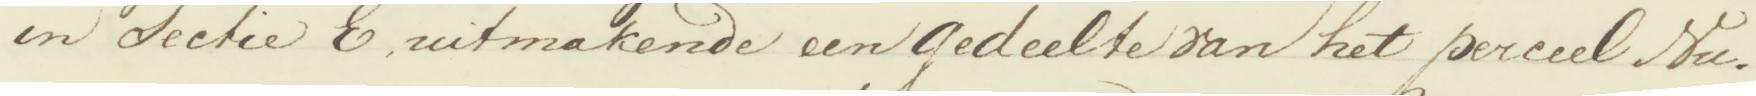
in sectie E, uitmakende een gedeelte van het perceel Nu„
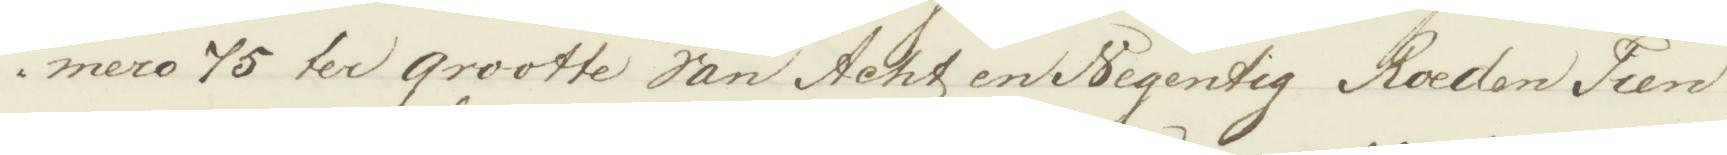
„mero 75 ter grootte van Acht en Negentig Roeden Tien
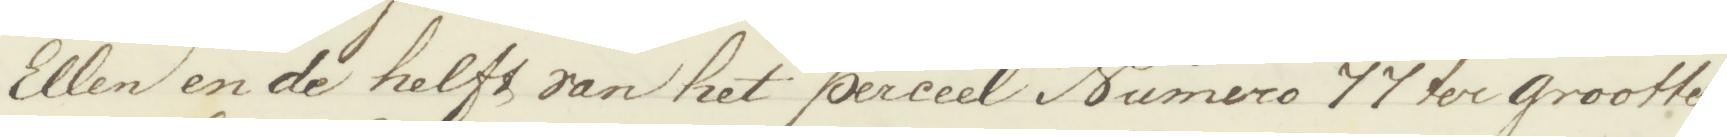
Ellen en de helft van het perceel Numero 77 ter grootte
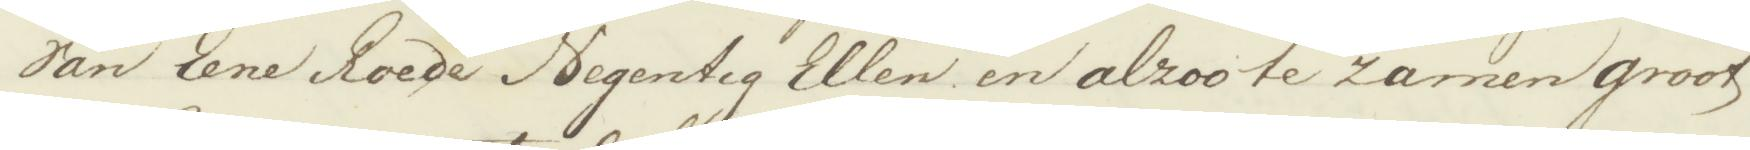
van Eene Roede Negentig Ellen en alzoo te zamen groot
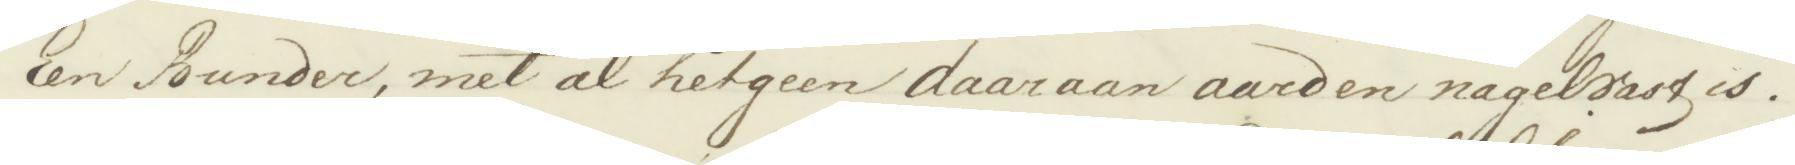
Een Bunder, met al hetgeen daaraan aard en nagelvast is.
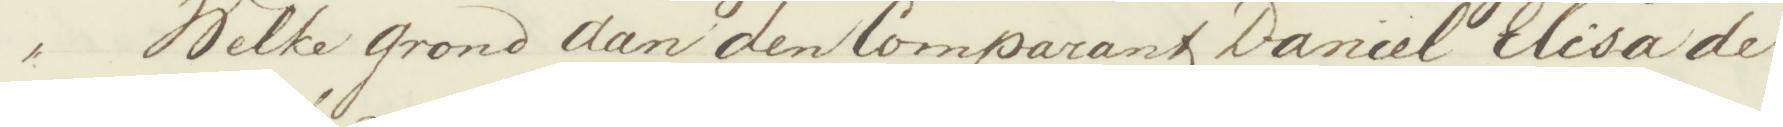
„ Welke grond Aan den Comparant Daniel Elisa de
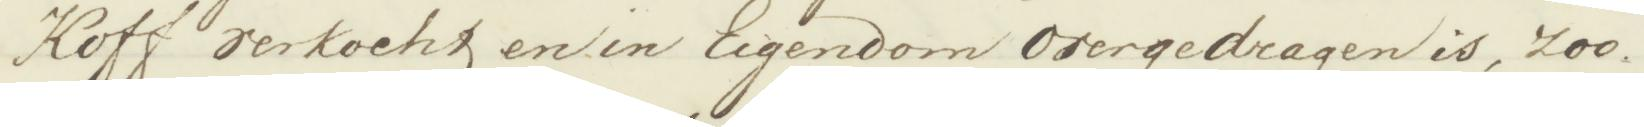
Koff verkocht en in Eigendom overgedragen is, zoo„
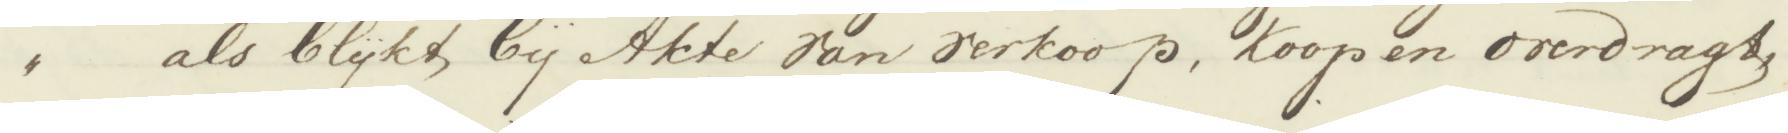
„ als blijkt bij Akte van verkoop, koop en overdragt,
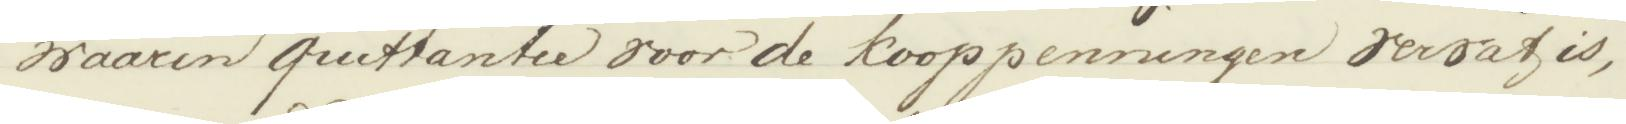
waarin quittantie voor de kooppenningen vervat is,
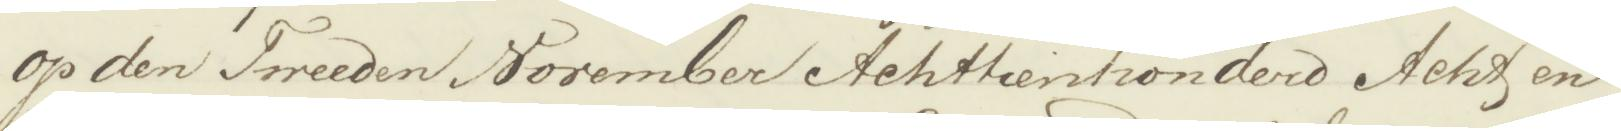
op den Tweeden November Achttienhonderd Acht en
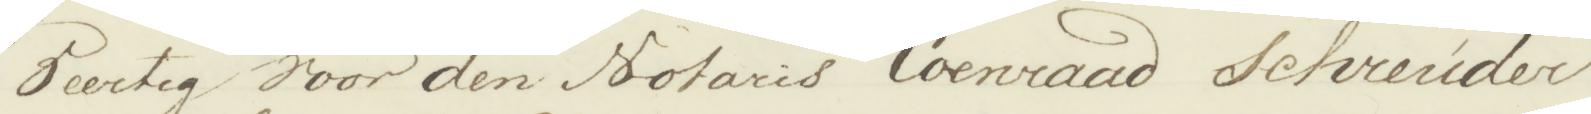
Veertig voor den Notaris Coenraad Schreuder
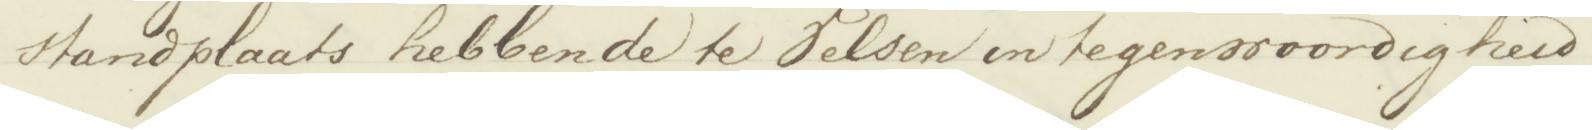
standplaats hebbende te Velsen in tegenwoordigheid
